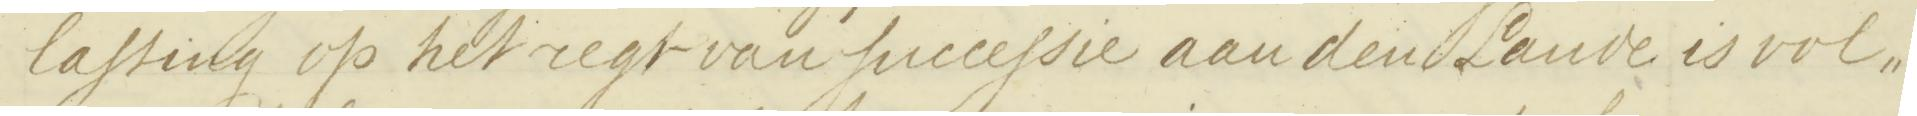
lasting op het regt van successie aan den Lande is vol„
